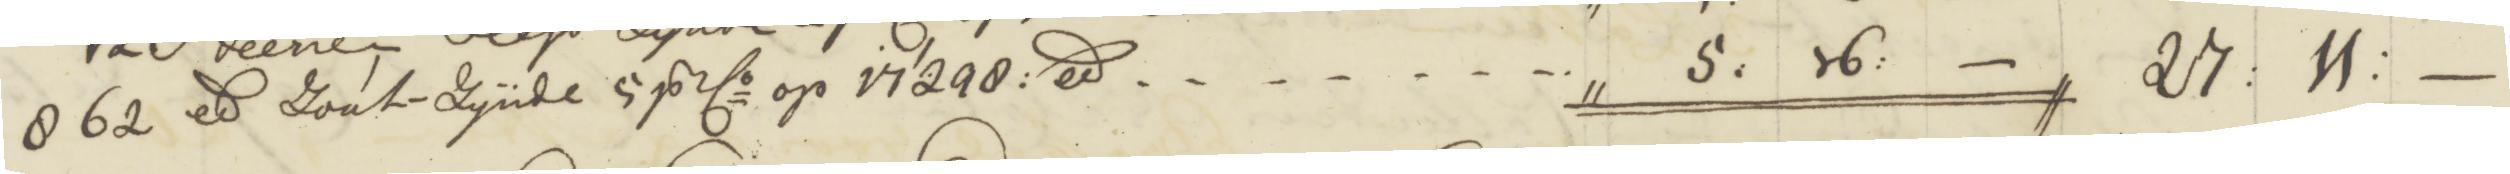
862 ed zout-zijnde 5 prC=o op 17'248: ed . - - - - - - . „ 5: 16: — „ 27: 11: —
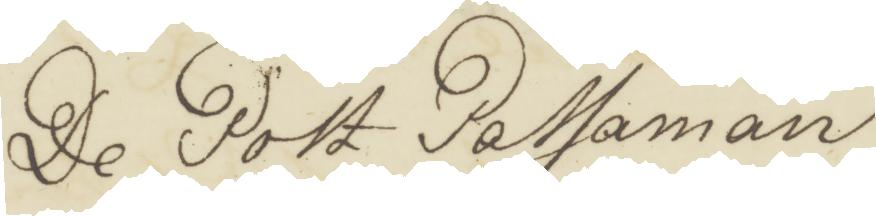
De Post Passaman
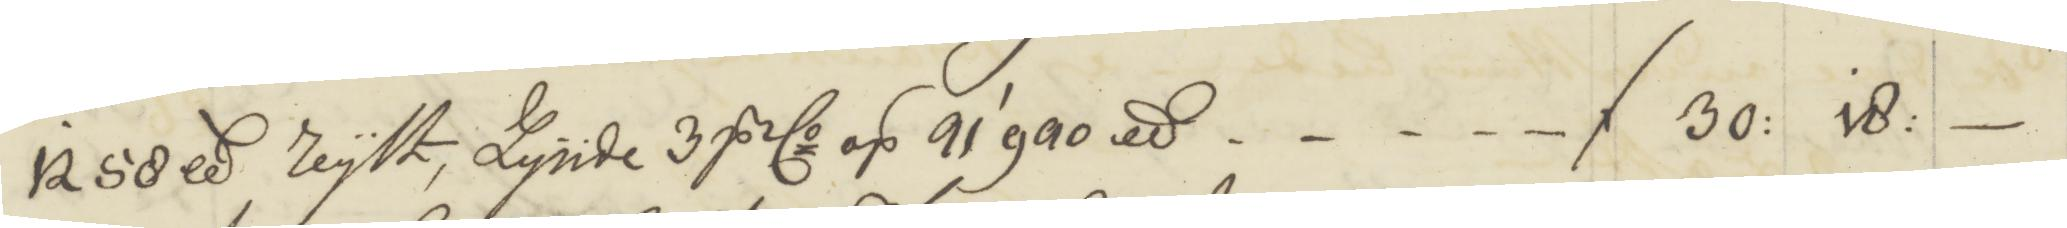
1258 ed reijst, zijnde 3 prC=o op 41'940 ed - - - - - ƒ 30: 18:—
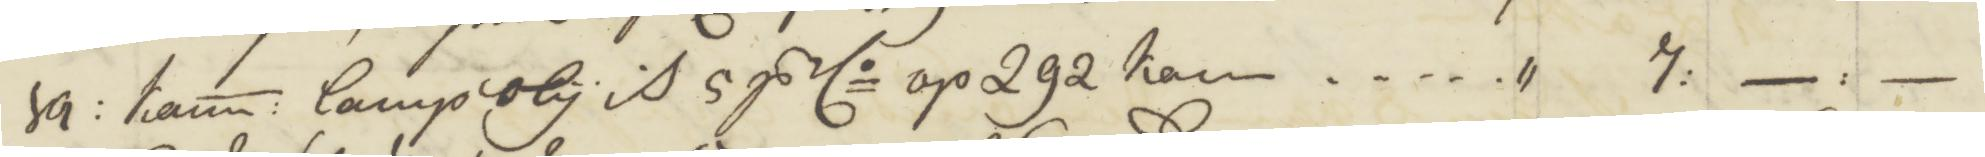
19: kann: Campolij is 5 prC=o op 292 kann . - - - . „ 7: —: —
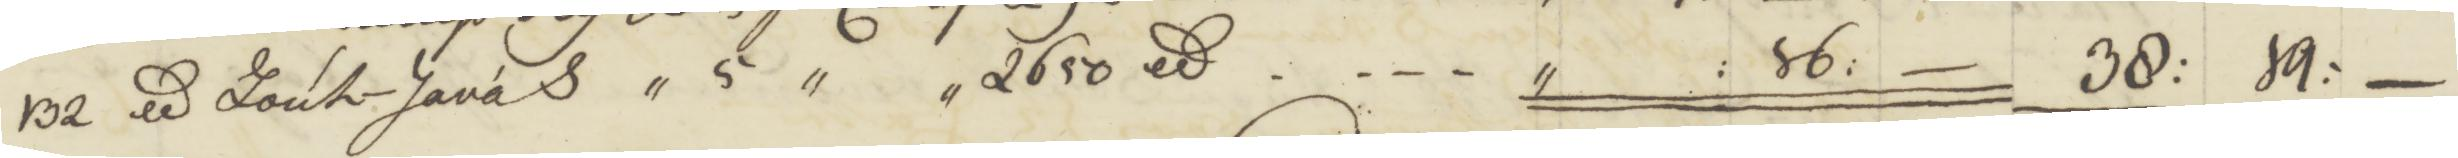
132 ed zout-Javas „ 5 „ „ 2650 ed . - - - „ : 16: — 38: 14: —
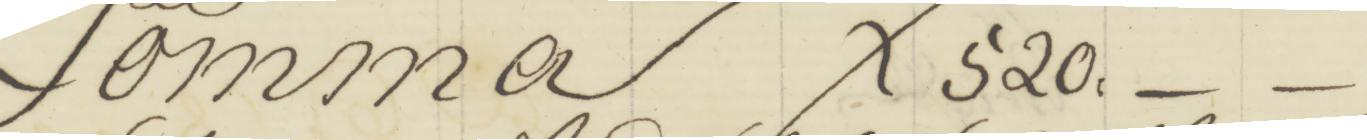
Somma ƒ 520: — —
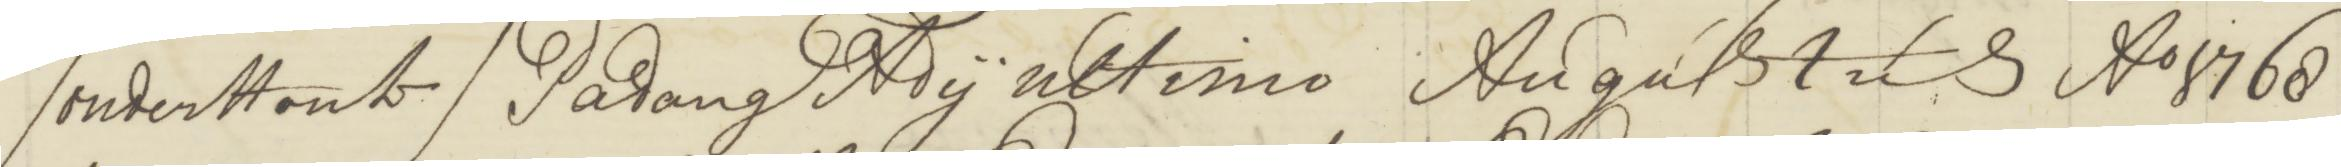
/onderstont / Padang Adij ultimo Augustus Ao 1768
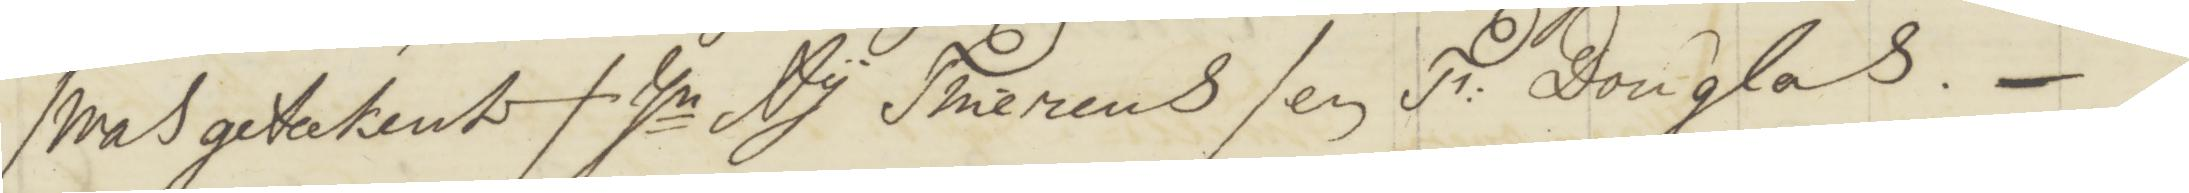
/was geteekent/ J=n Aij Thierens / en F: Douglas. —
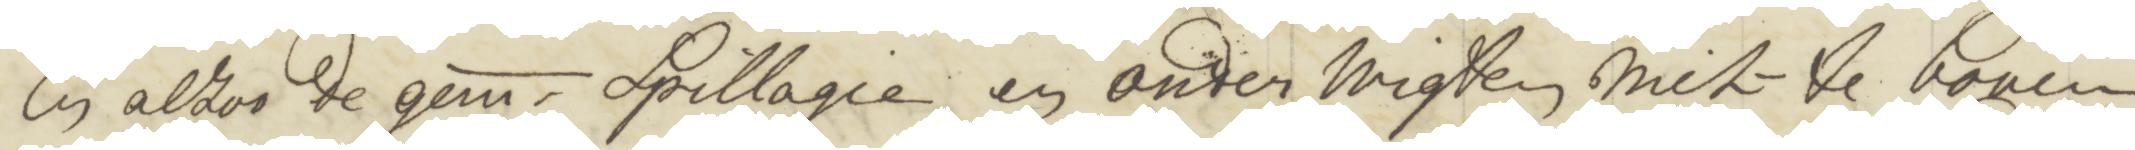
En alzoo de gem: Spillagie en onder wigten niet-te boven
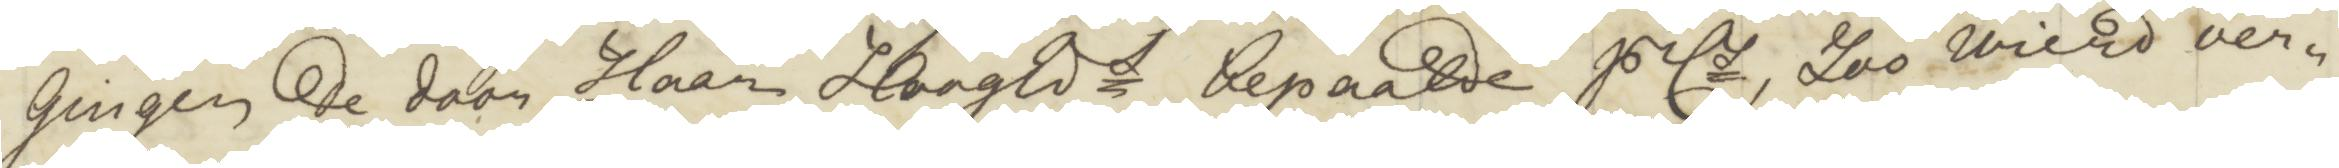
gingen de door Haar HoogEd=s bepaalde prC=s, zoo wierd ver„
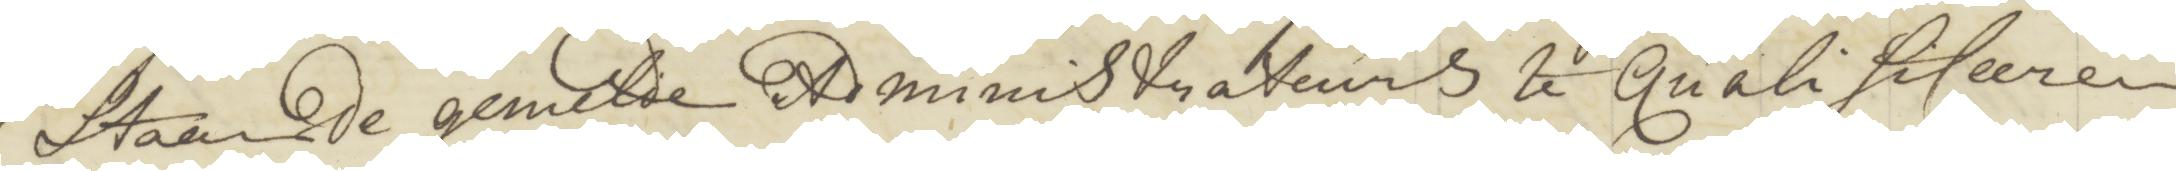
staande gemelde Administrateurs te qualificeeren,
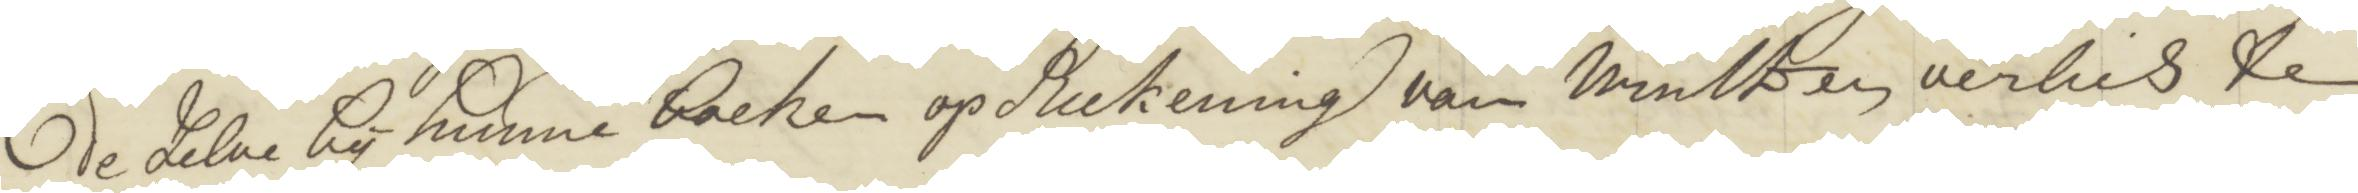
de zelve bij hunne boeken op Reekening van winst en verlies te
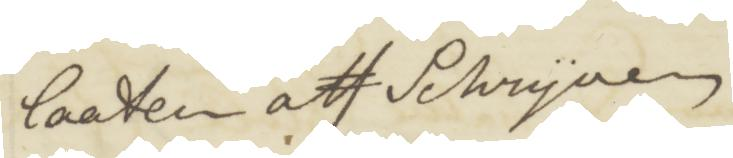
laaten affschrijven
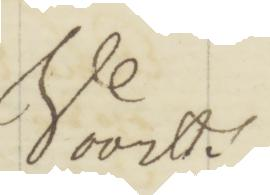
Voorts.
